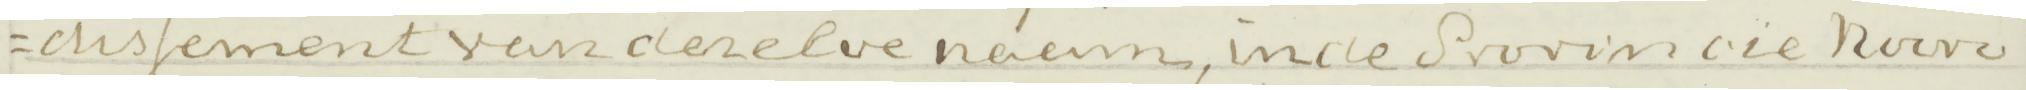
=dissement van dezelve naam, in de Provincie Noord
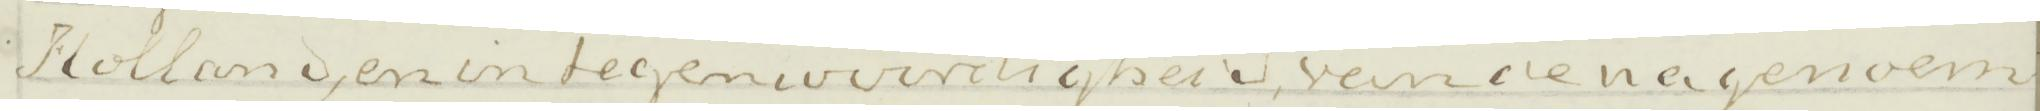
Holland, en in tegenwoordigheid, van de nagenoem
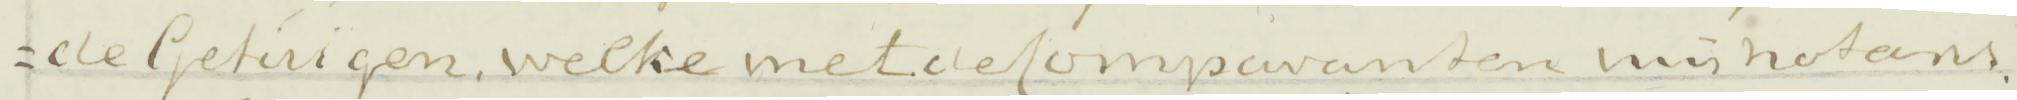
=de Getuigen, welke met de Comparanten mij notaris
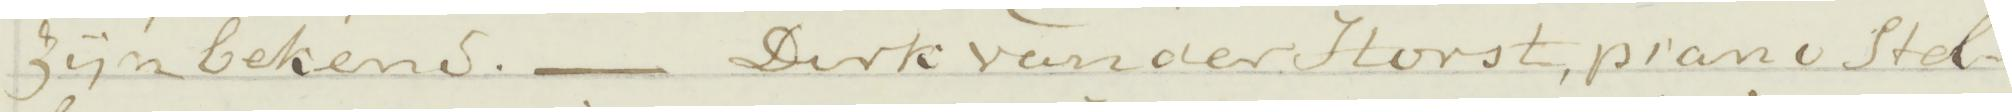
Zijn bekend. — Dirk van der Horst, piano stel-
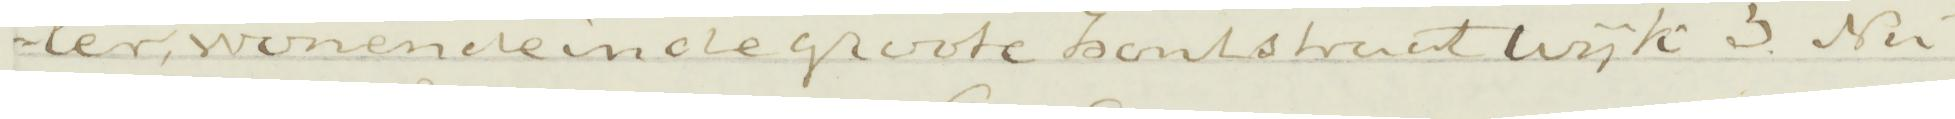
=ler, wonende in de groote houtstraat wijk 3. Nu
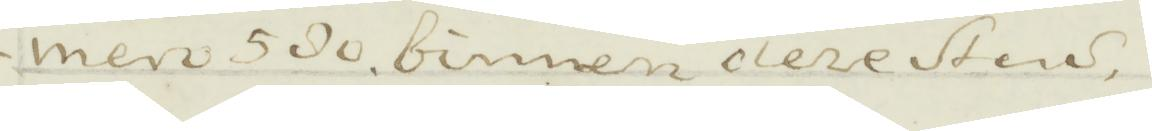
mero 580. binnen deze Stad,
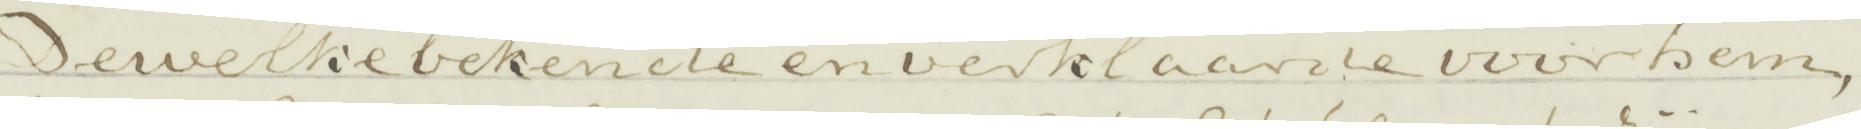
Dewelke bekende en verklaarde voor hem
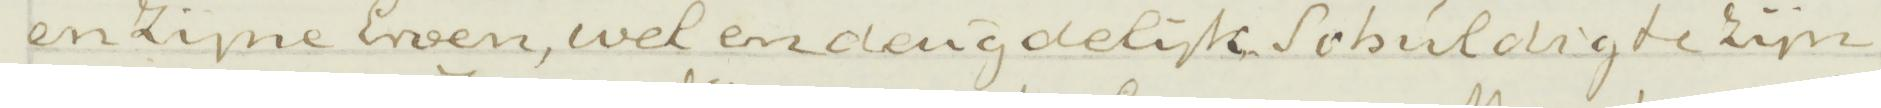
en zijne Erven, wel en deugdelijk schuldig te zijn
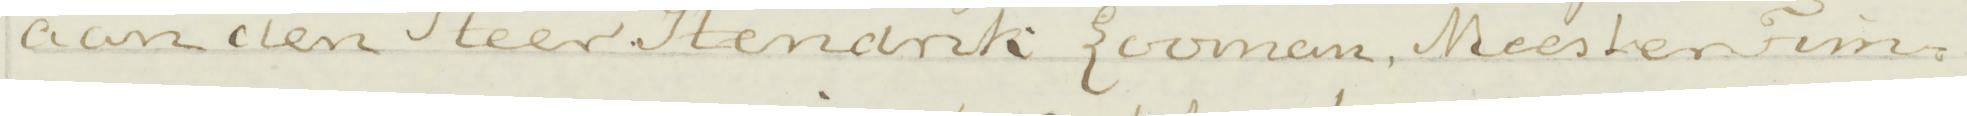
aan den Heer Hendrik Looman, Meester Tim=
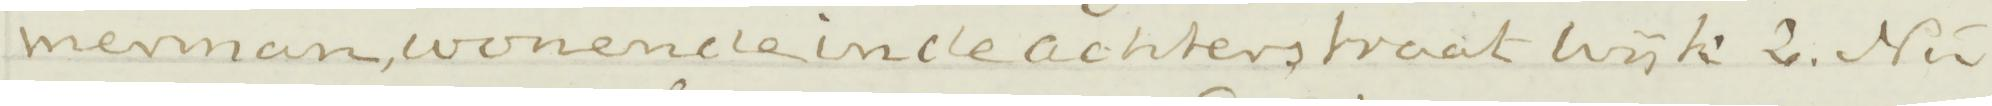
merman, wonende in de achterstraat wijk 2. Nu
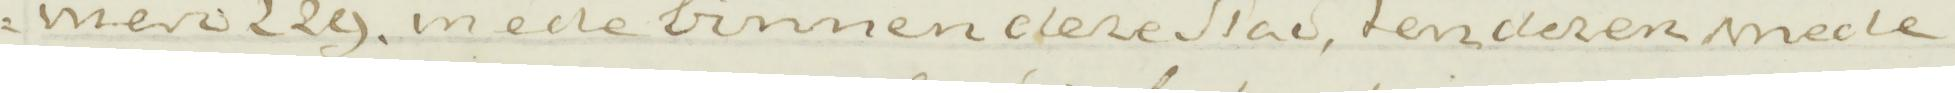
mero 229. mede binnen deze stad, ten dezen mede
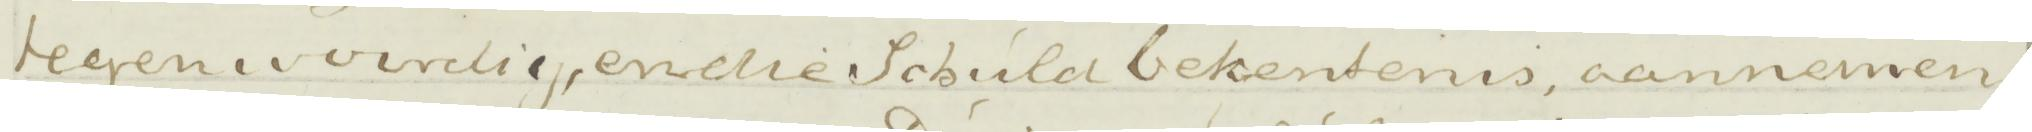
tegenwoordig, en die schuld bekentenis, aannemen-
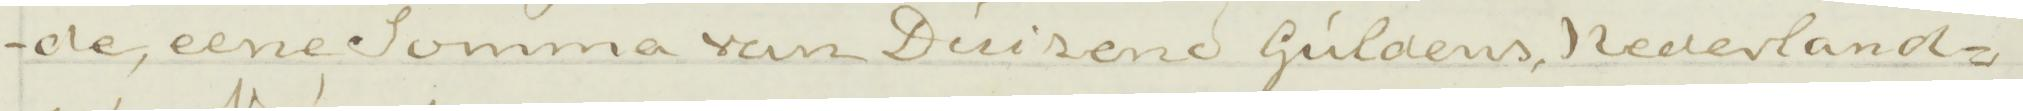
-de, eene somma van Duizend Guldens, Nederland=
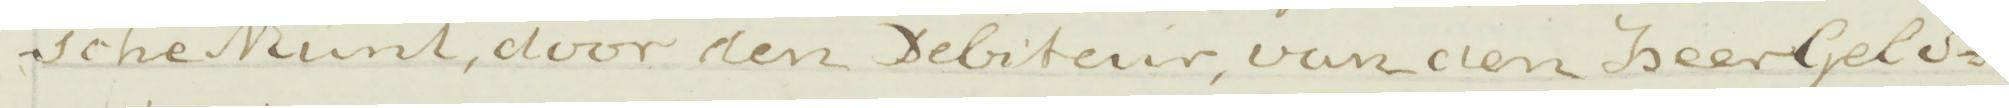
-sche Munt, door den Debiteur, van den heer Geld=
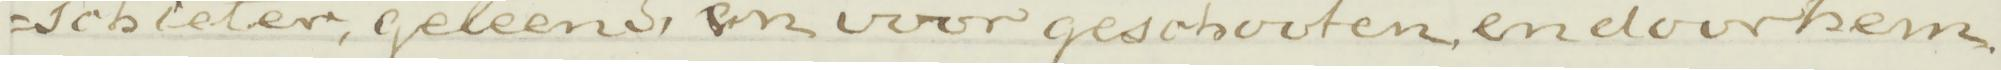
=schieter, geleend en voor geschooten, en door hem
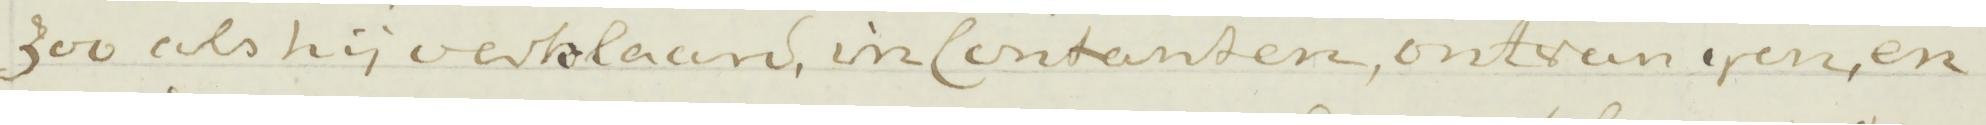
zoo als hij verklaard, in Contanten, ontvangen, en
